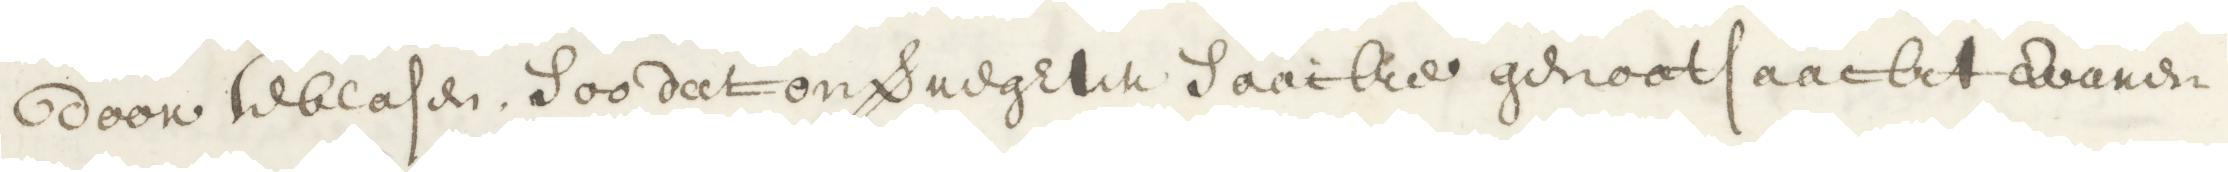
door teblasen, Soo dat onverreght in Saacke genootsaackt waren
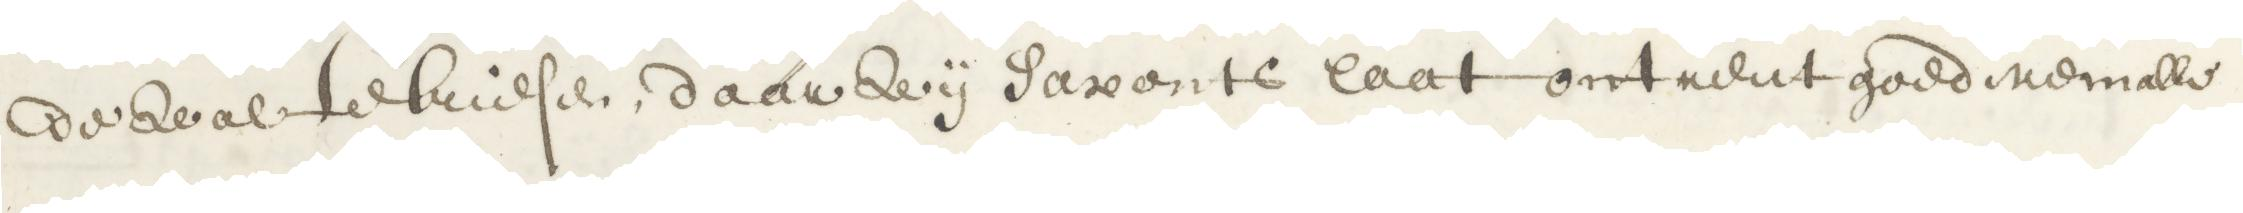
de wal te kiesen, daar wij Savonts laat ontrent goediremalle
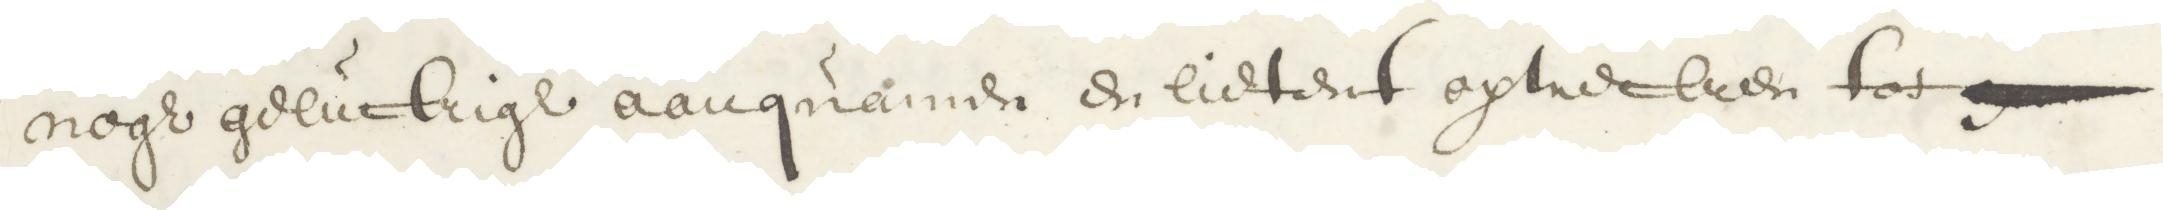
nogh geluckigh aanquamen en lieten t optrecken tot ap
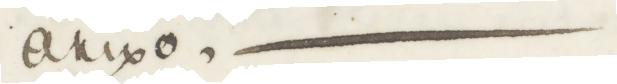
aripo. —
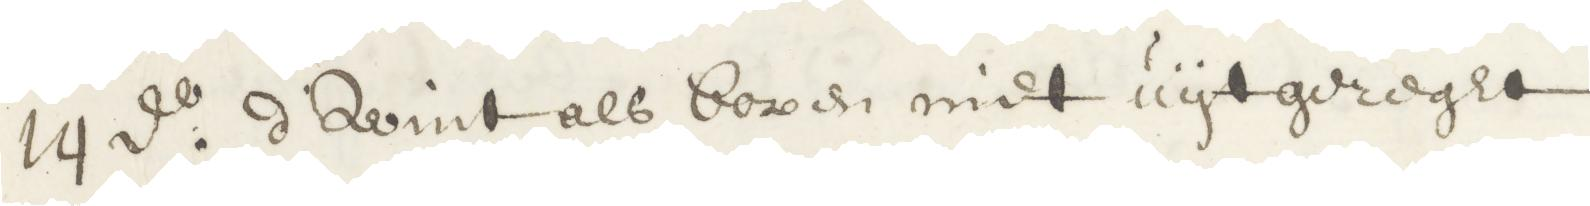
14 d:o d’ Wint als boven niet uijtgereght
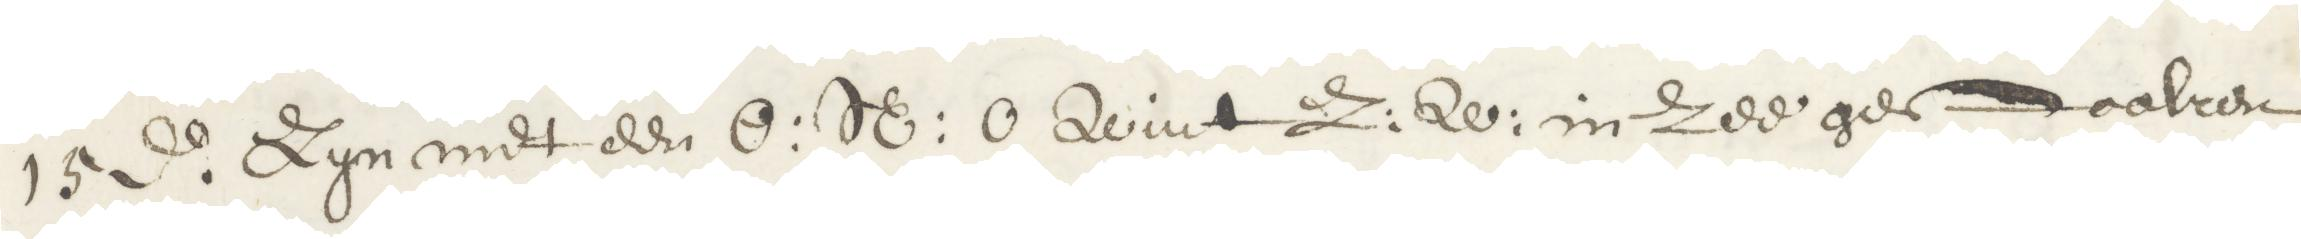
15 d:o Zyn met een O: N: O Wint Z: W: in Zee gestooken
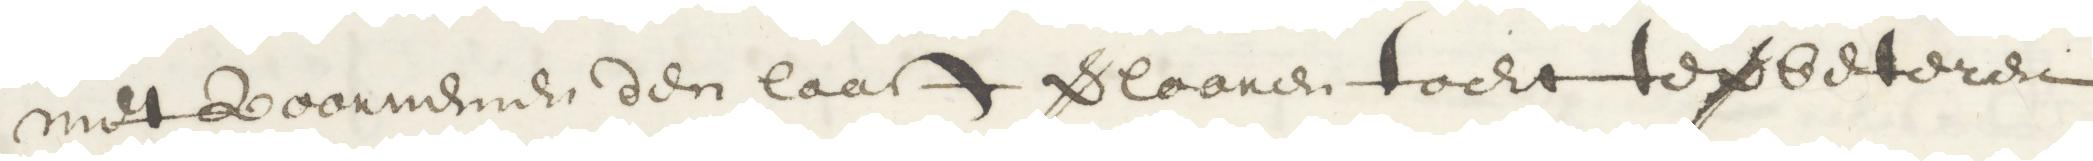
met Voornemen den laast verlooren tocht te verbeteren
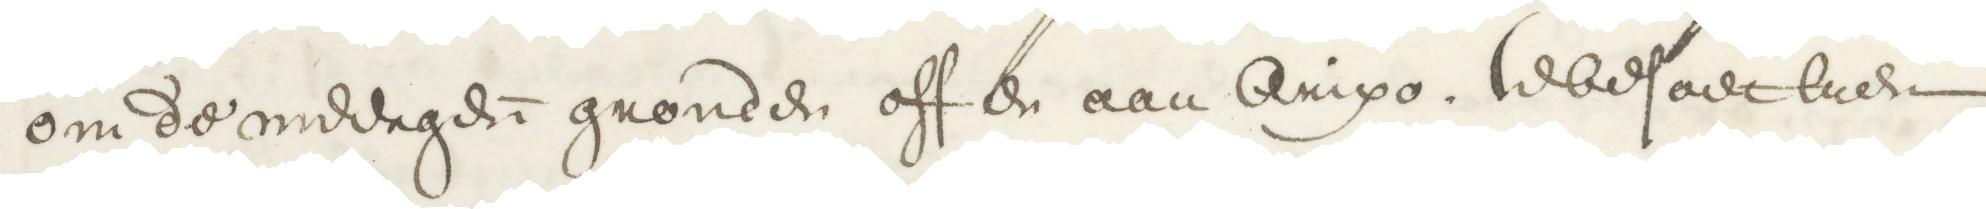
om de meergen gronden off en aan Aripo. tebesoecken
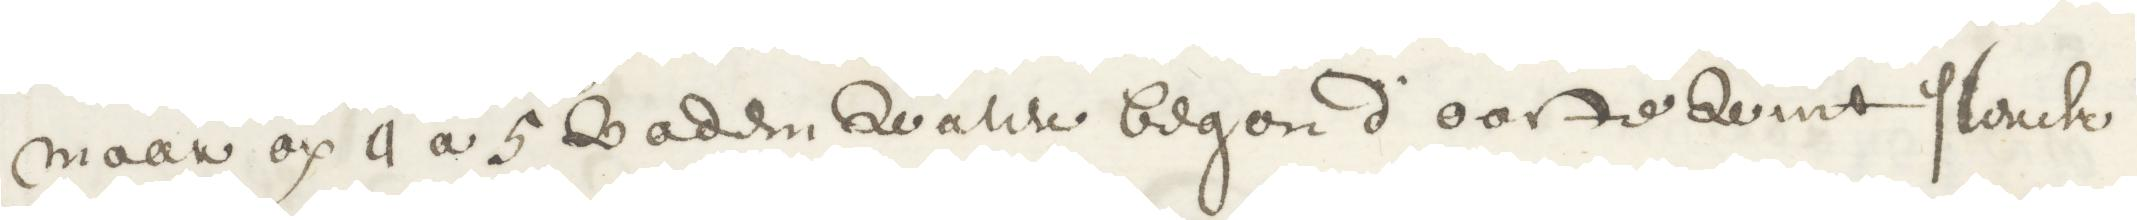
maar op 4 a 5 Vadem Water begon d' ooste Wint Sterck
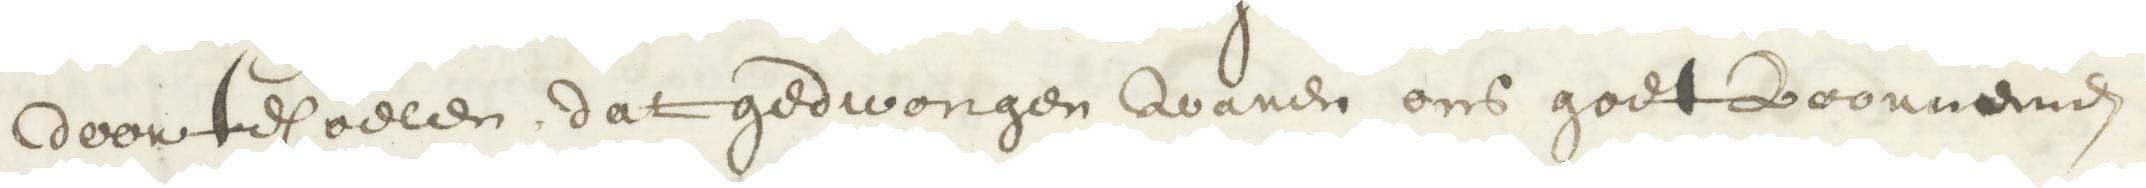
door te Coelen, dat gedwongen waren ons goet voornemen
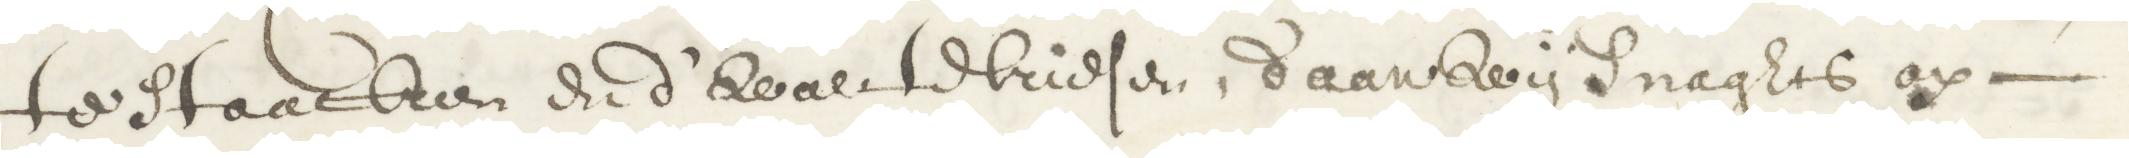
te Staacken en d’ wal te kiesen, daar wij S naghts op —
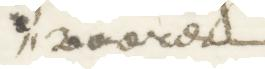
„ vooren
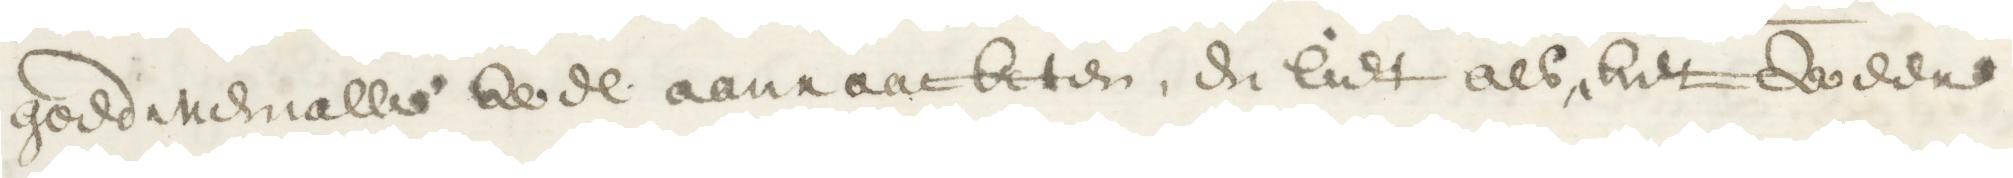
goediremalle wel aanraackten, en liet als het weer
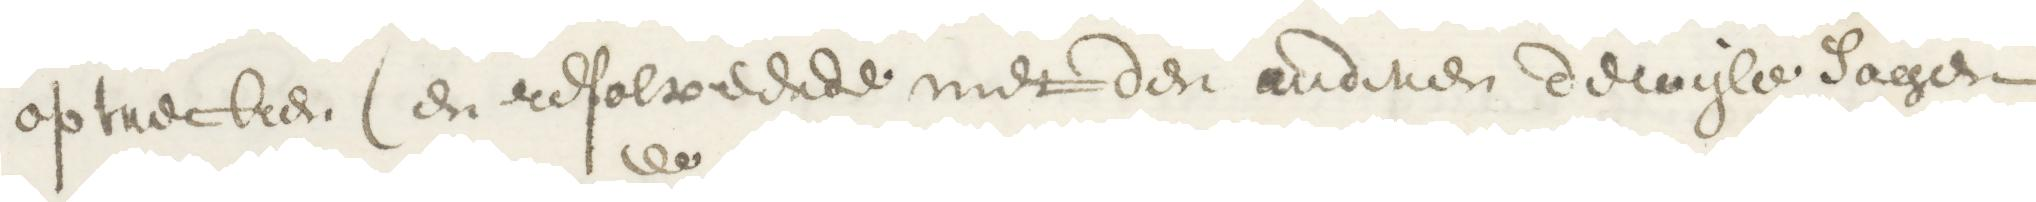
optrecken (en resolveerde met den anderen dewijle Sagen
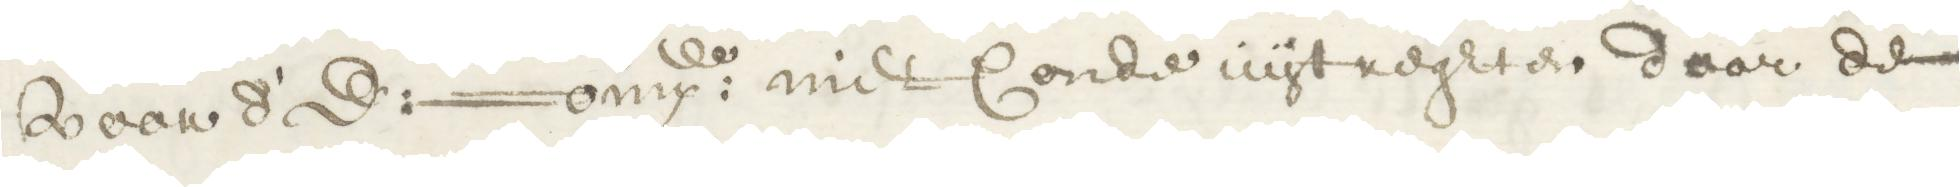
voor d’ E: Comp:e niet Conde uijt reghten door de
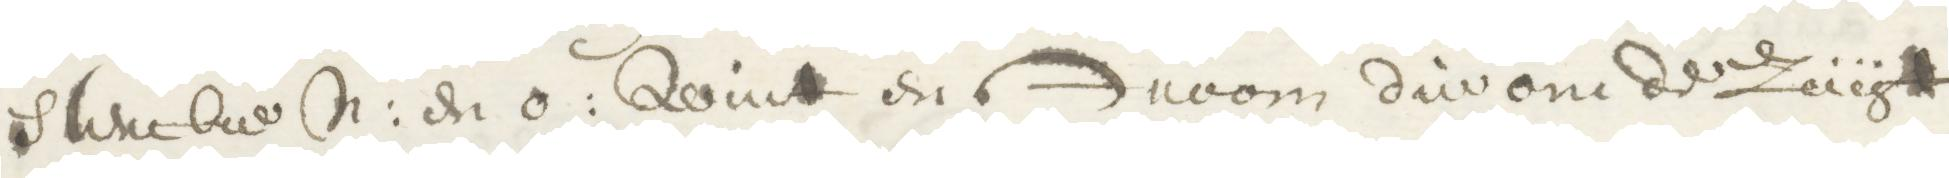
stercke N: en o: wint en stroom die om de Zuijt
